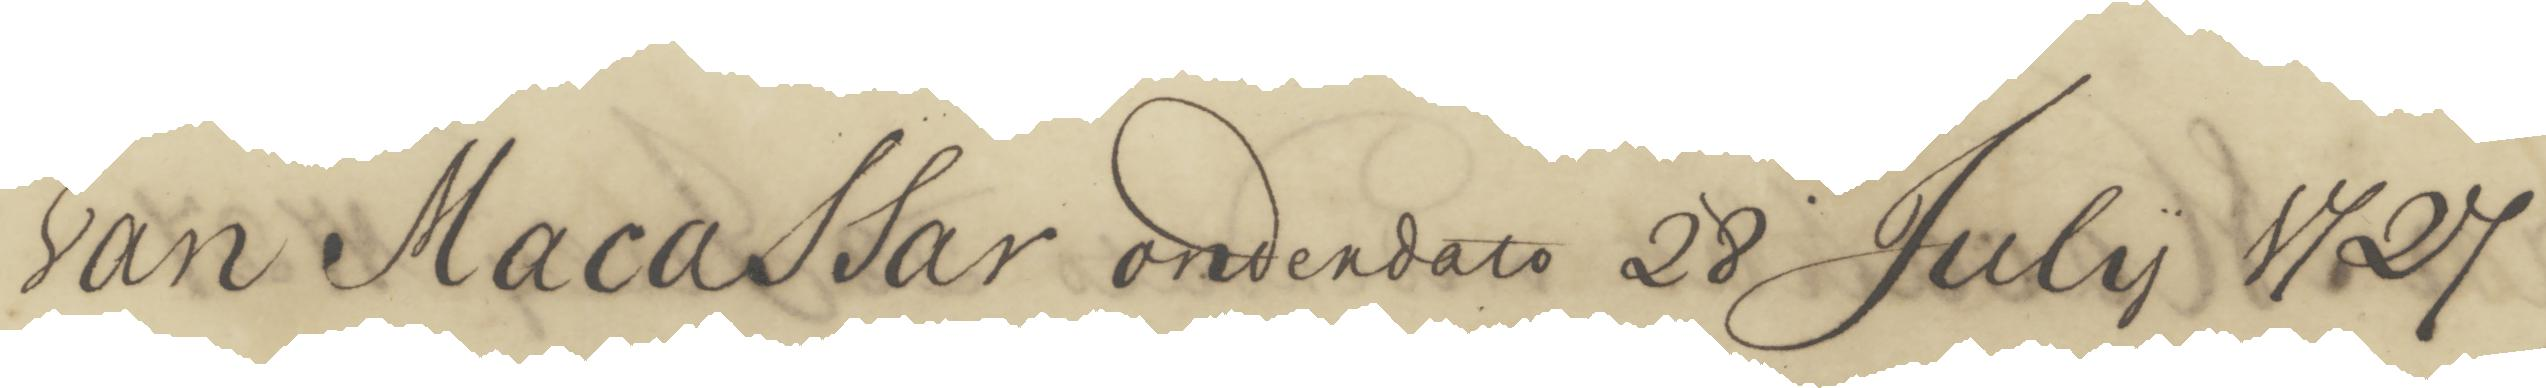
Van Macassar onderdato 28 Julij 1727
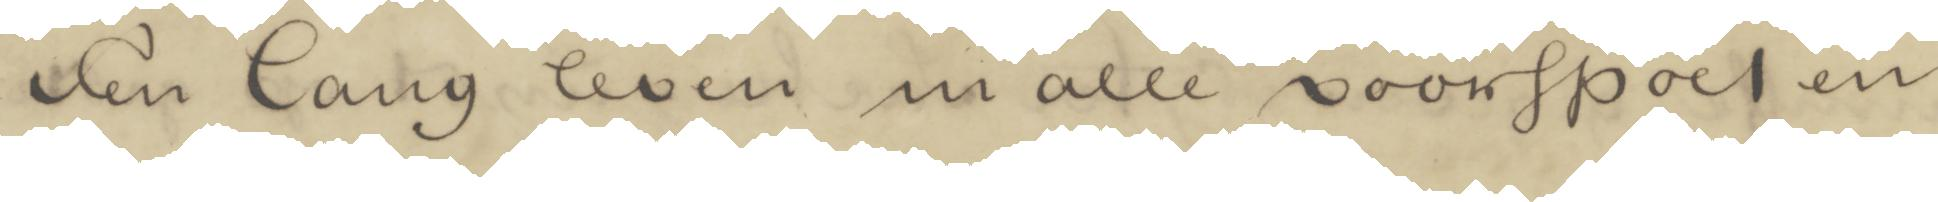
Een lang leven in alle voorspoet en
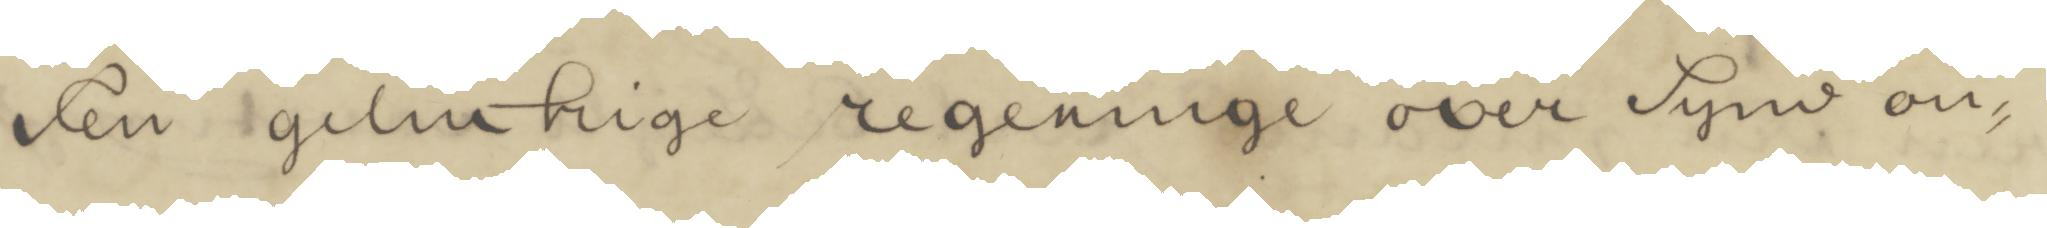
Een geluckige regeringe over sijne on„
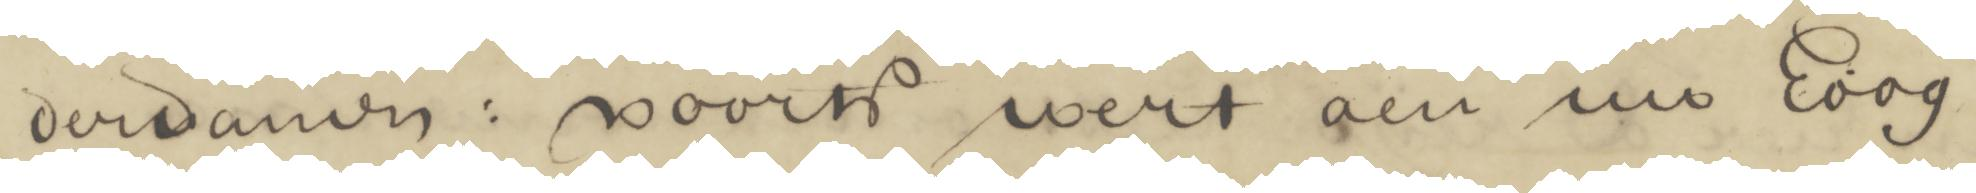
derdanen: voorts wert aen uw hoog
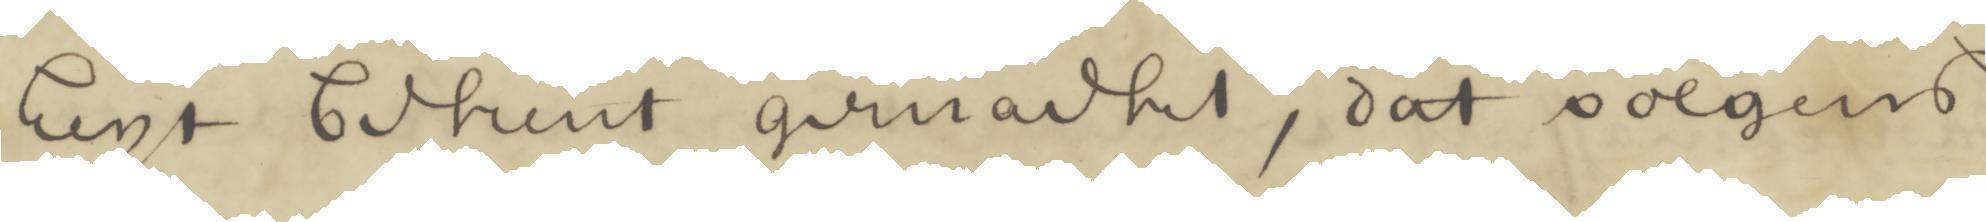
heyt bekent gemaekt, dat volgens
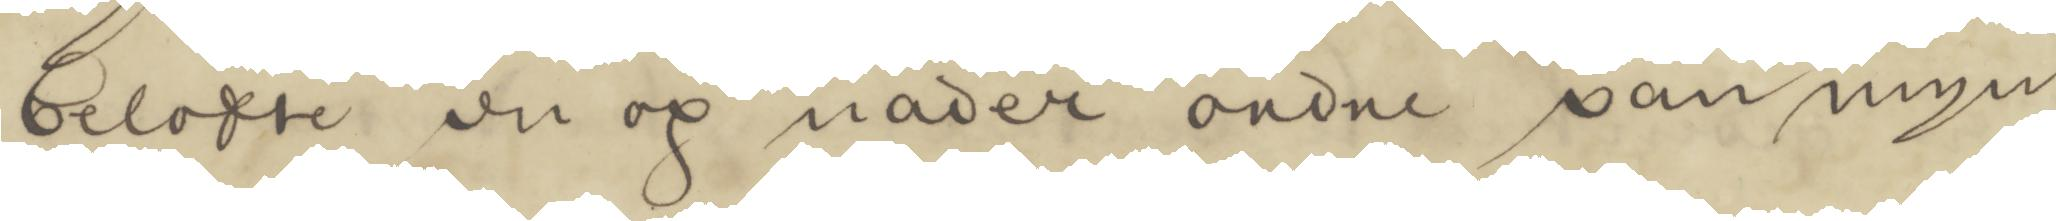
belofte en op nader ordre van myn
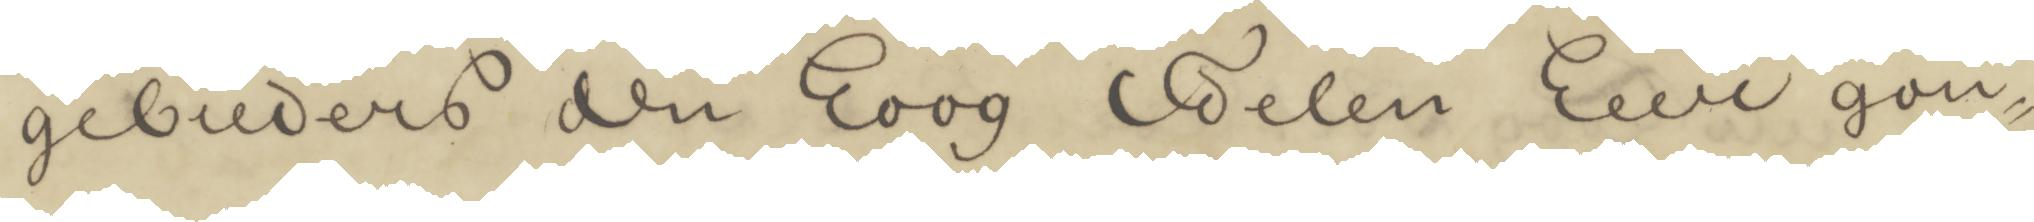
gebieders den hoog Edelen heer gou„
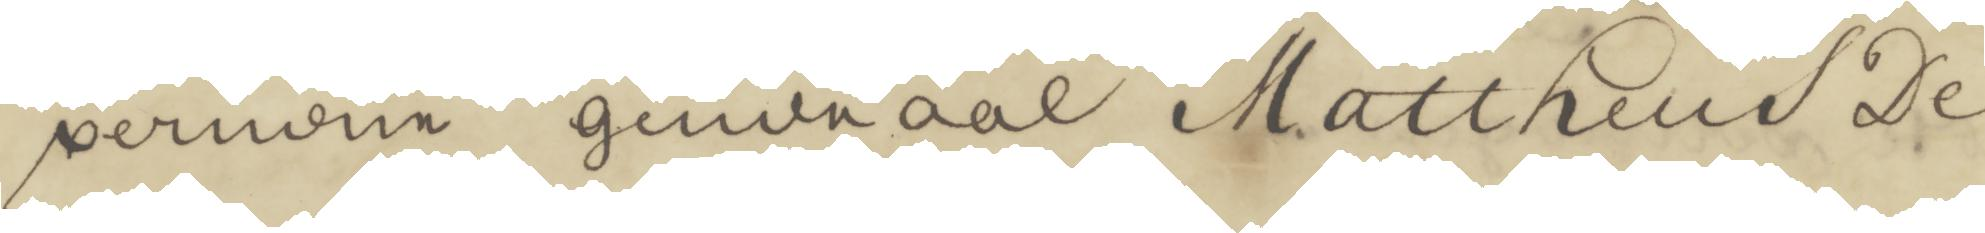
verneur generaal Mattheus De
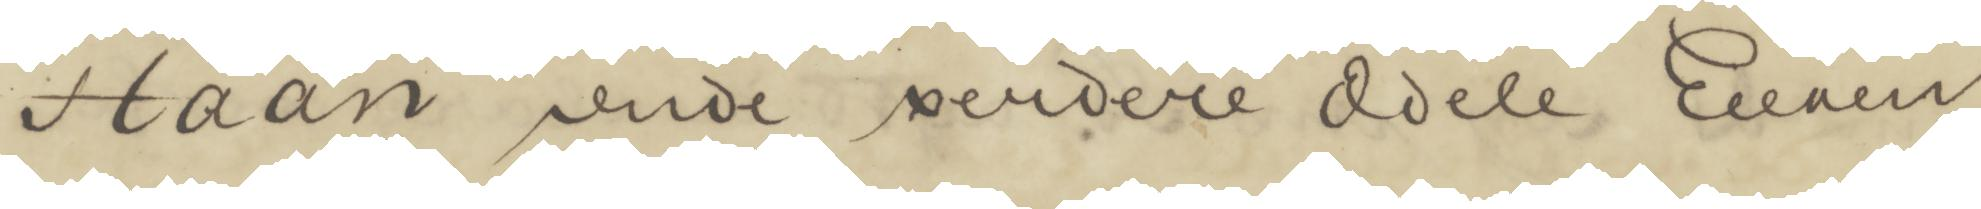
Haan ende verdere Edele heeren
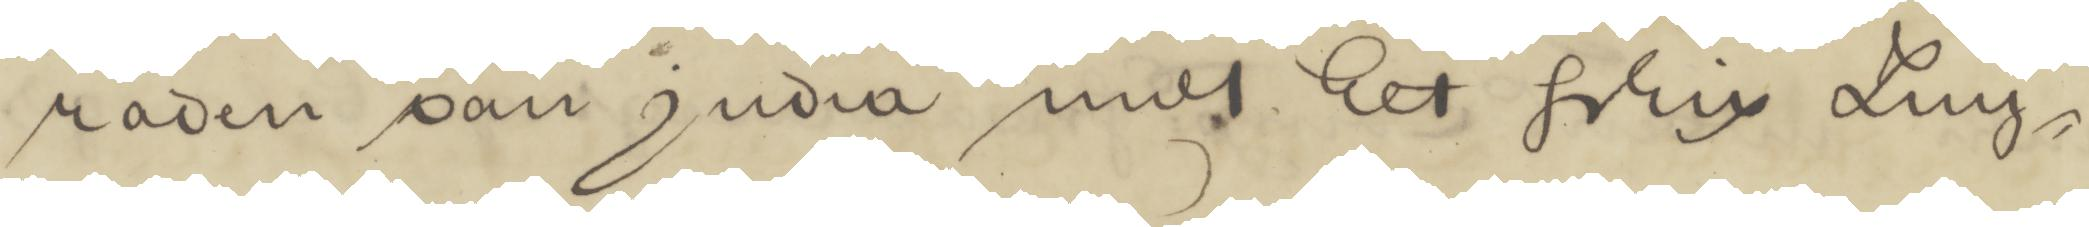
raden van jndia met het schip zuij„
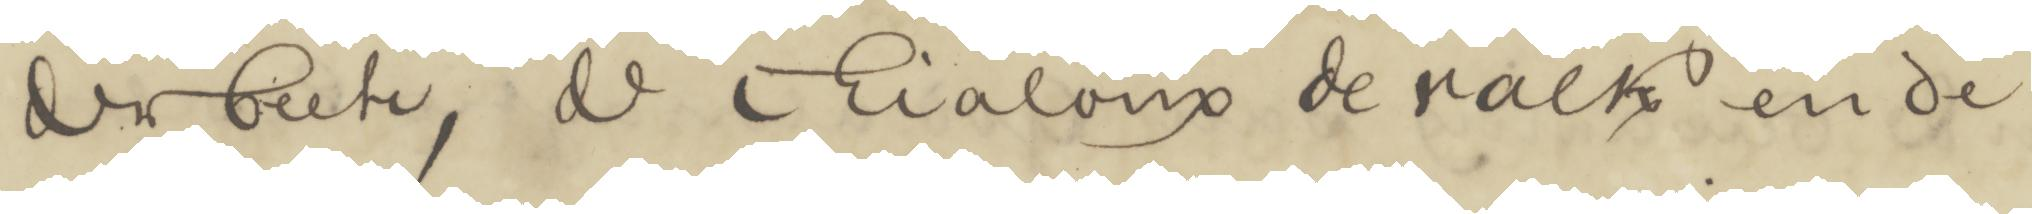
derbeek, de Chialoup de valk en de
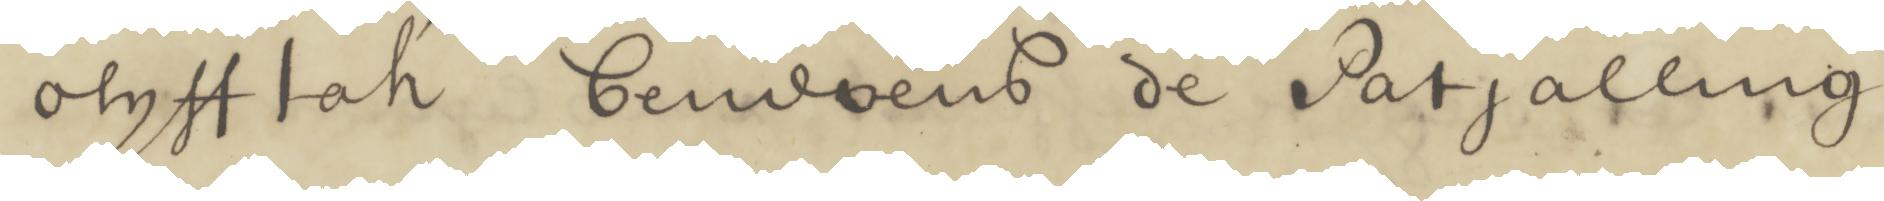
olyfftak benevens de Patjalling
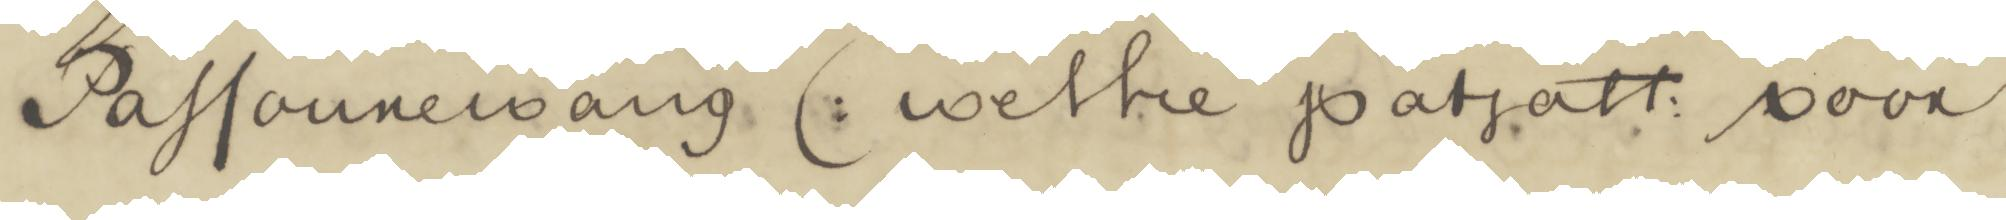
Passourewang (: welke patjall: voor
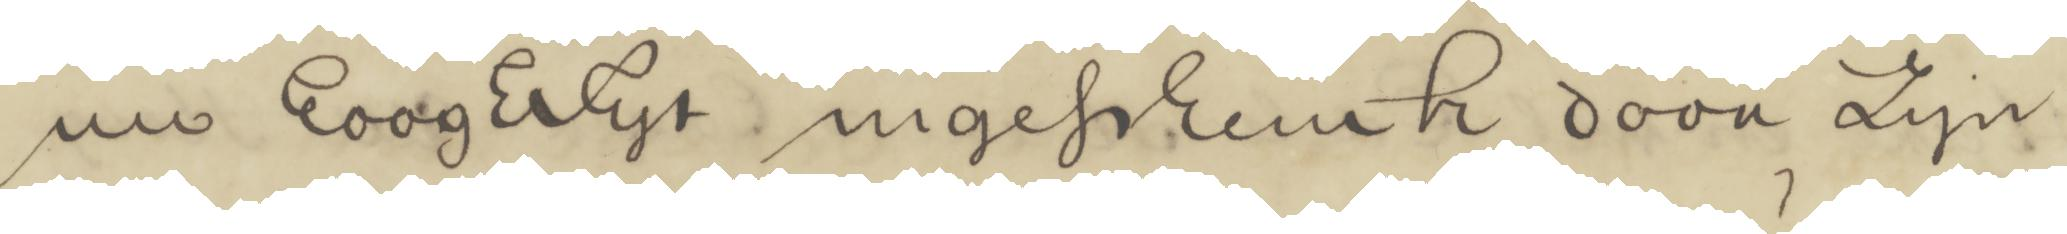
uw hooghEijt in geschenck door zijn
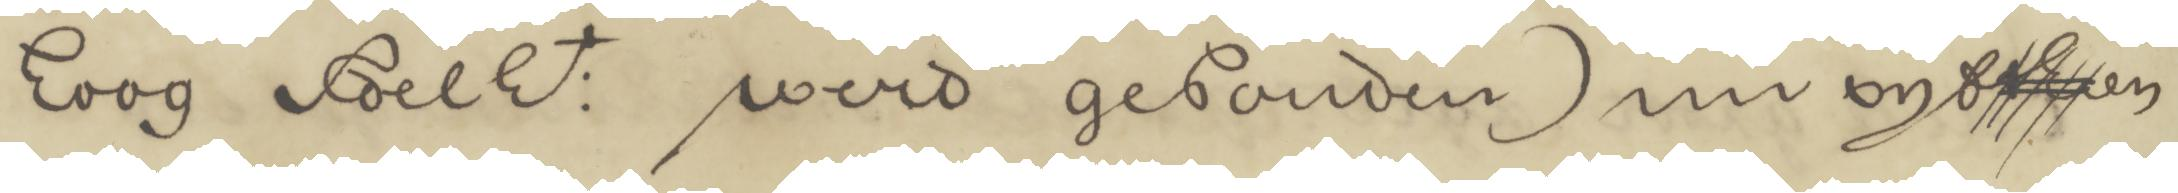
hoog Edelh:t werd gesonden) nu vyfthien
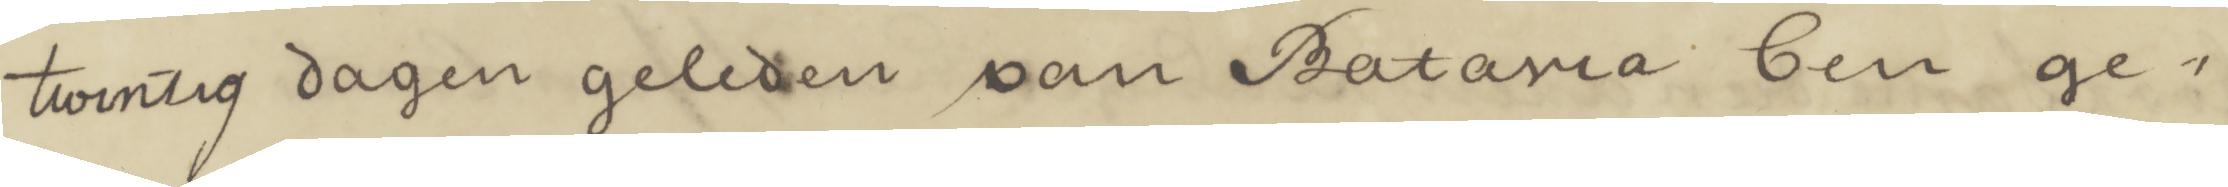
twintig dagen geleden van Batavia ben ge„
